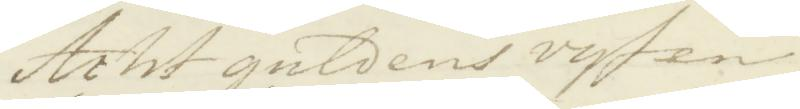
Acht guldens vyf en
